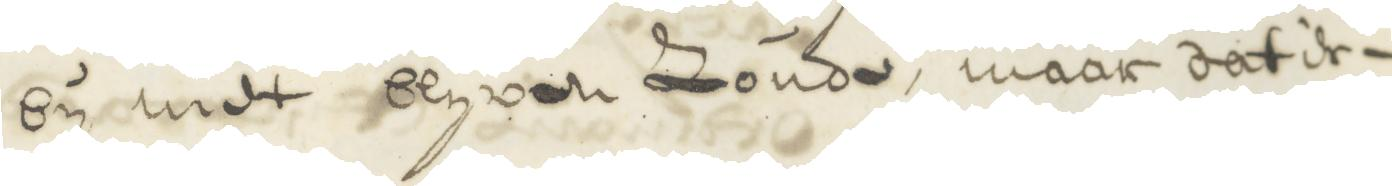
bij niet blijven zoude, maar dat ’er
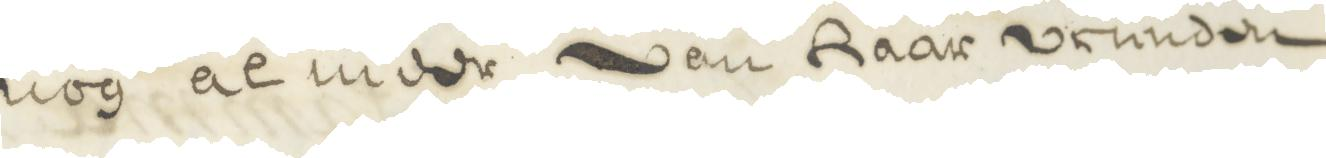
nog al meer van haar vrunden
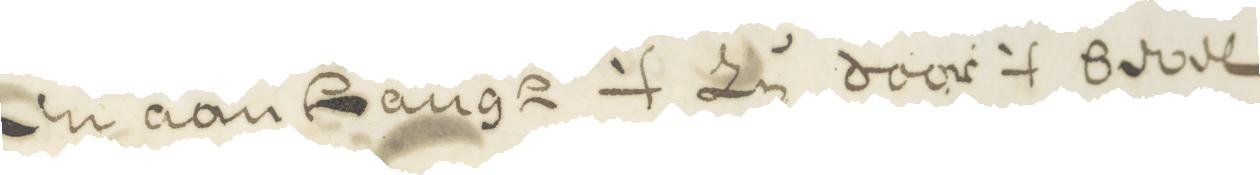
en aan hangh ’t zij door ’t bevel
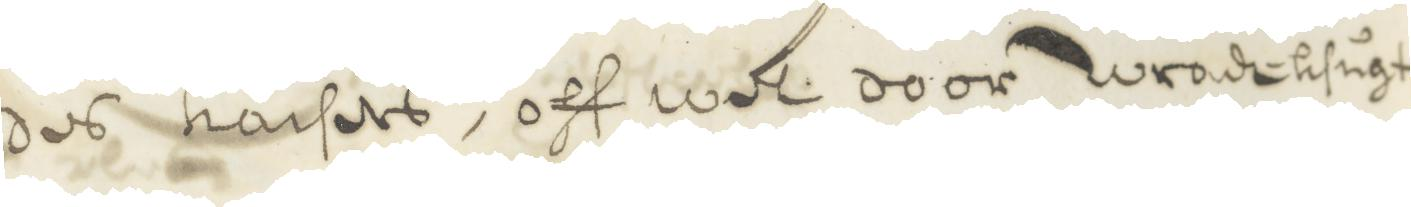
des kaisers, off wel door wraecksugt
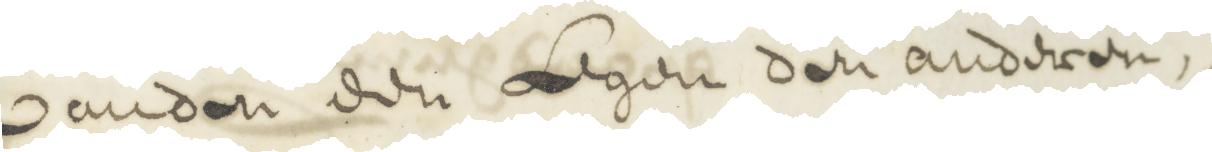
vanden een tegen den anderen,
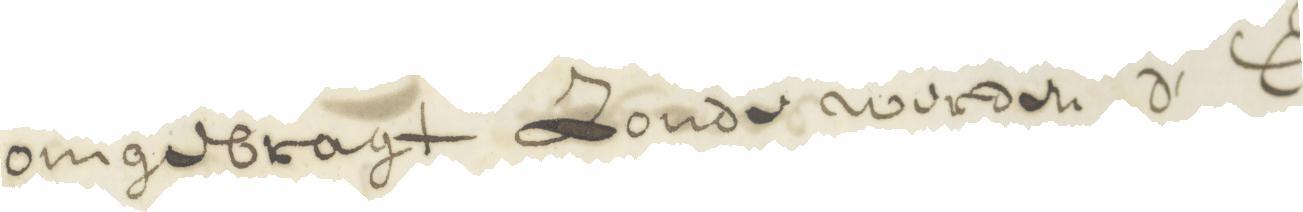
omgebragt zoude werden, d’ E.
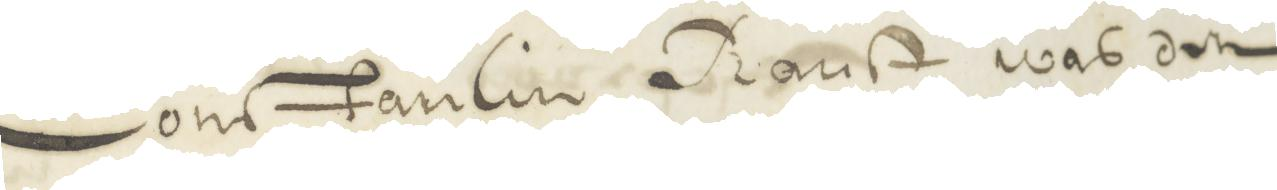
Constantin Ranst was den
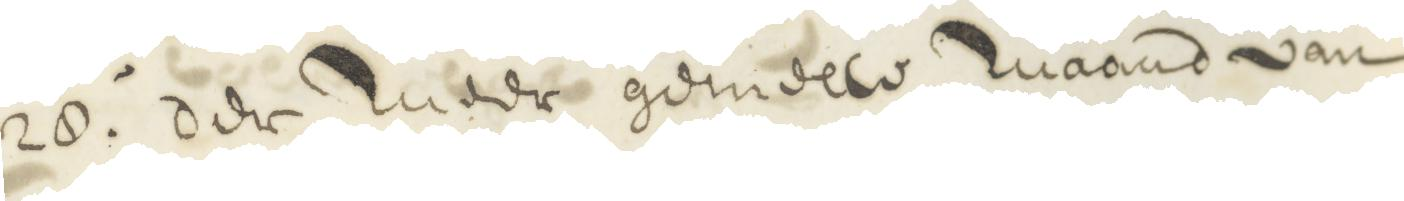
28. der meer gemelte maand van
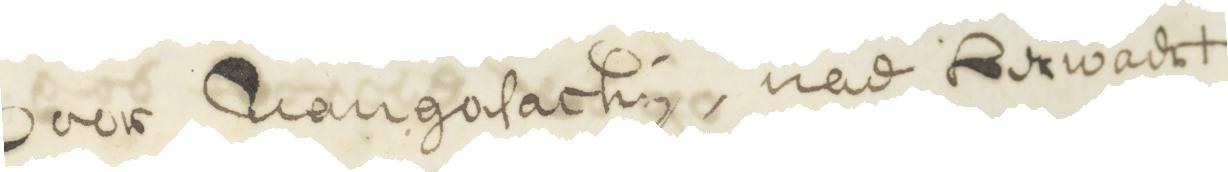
voor Nangosackij, nae herwaerts
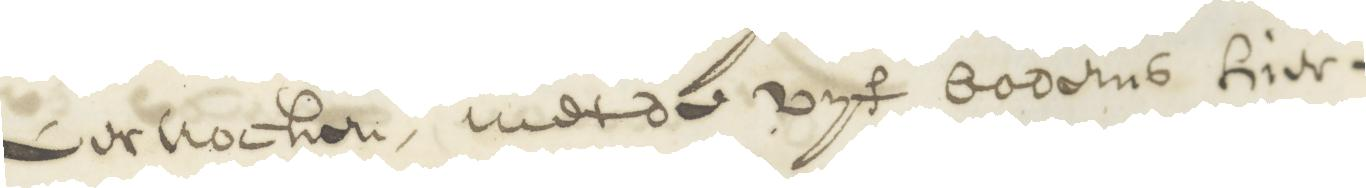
vertrocken, met de vyf bodems hier
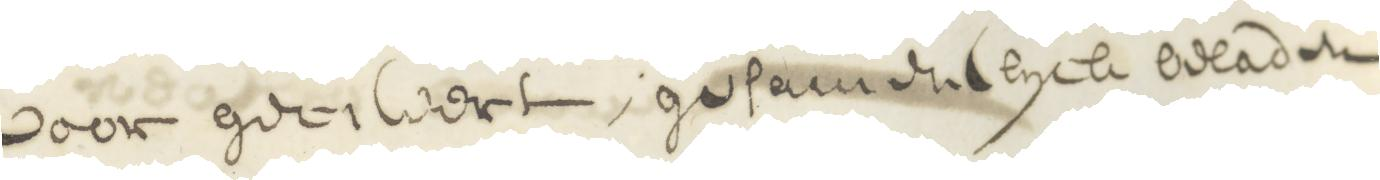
voor geciteert; gesamentlyck beladen
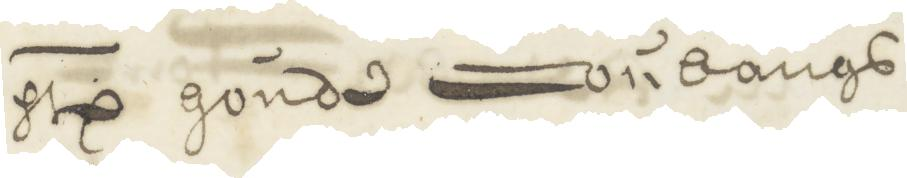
stx goude coubangs
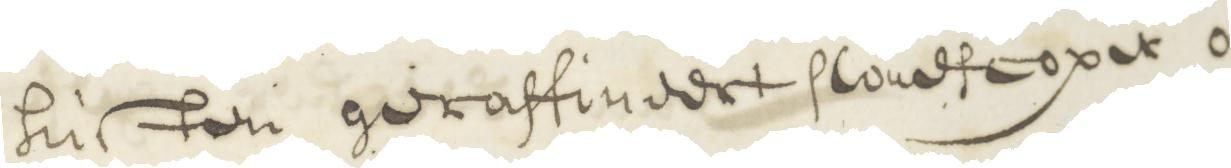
susten geraffineert storefcoper off
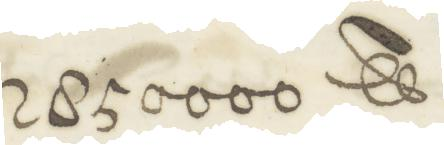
2850000 lb
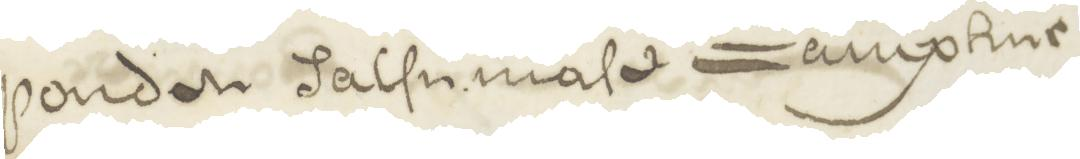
ponden Satsumase Camphur
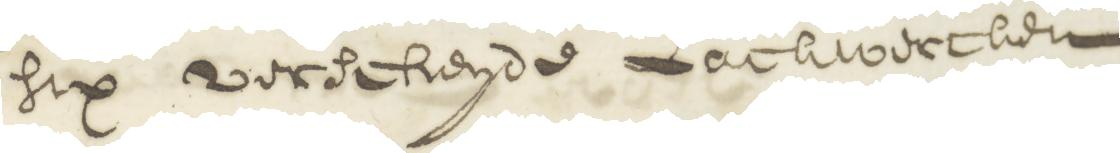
stx verscheyde Lackwercken
